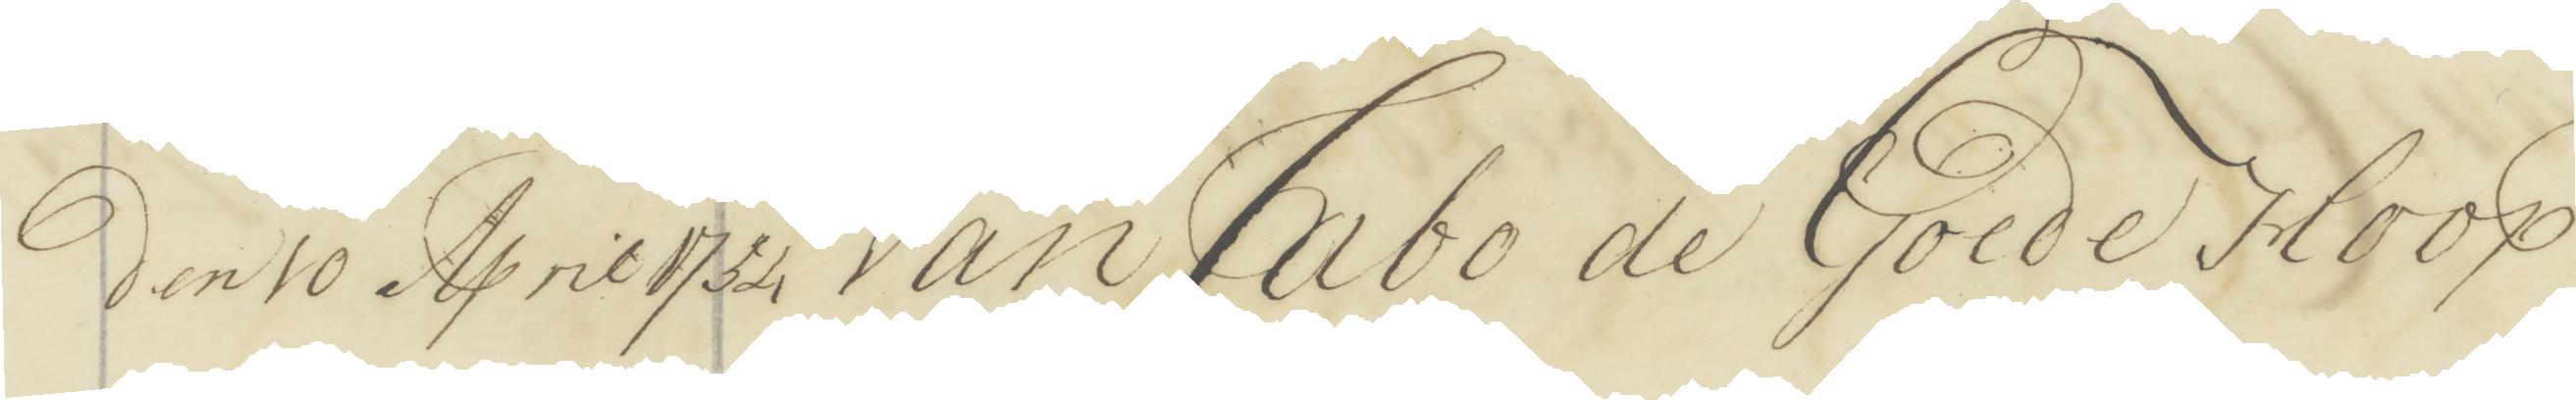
den 10 April 1754 Van Cabo de Goede Hoop
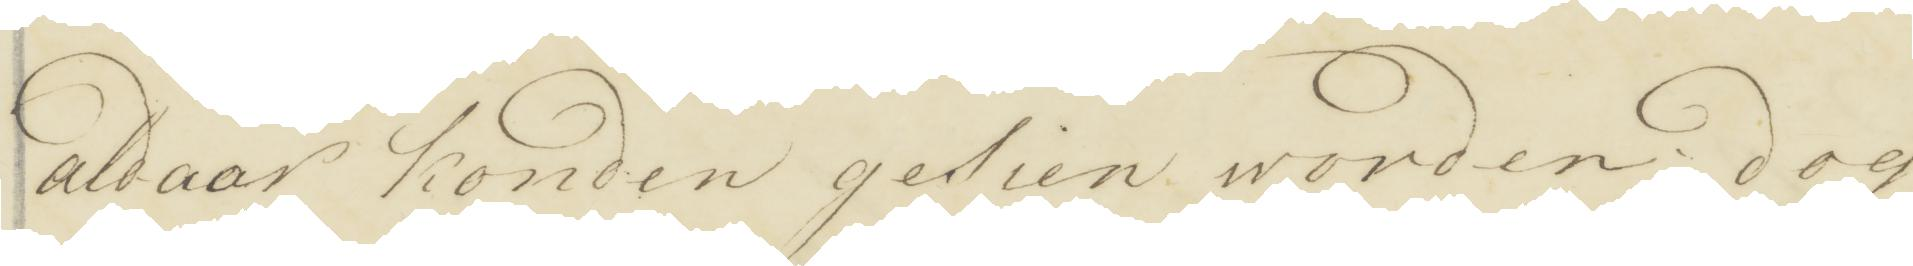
aldaar konden gesien worden; dog
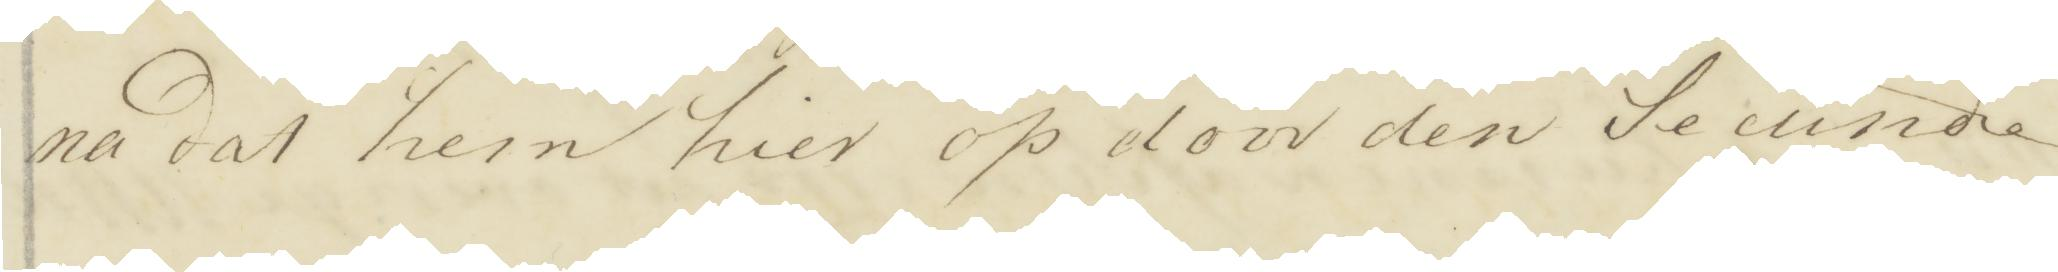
na dat hem hier op door den secunde
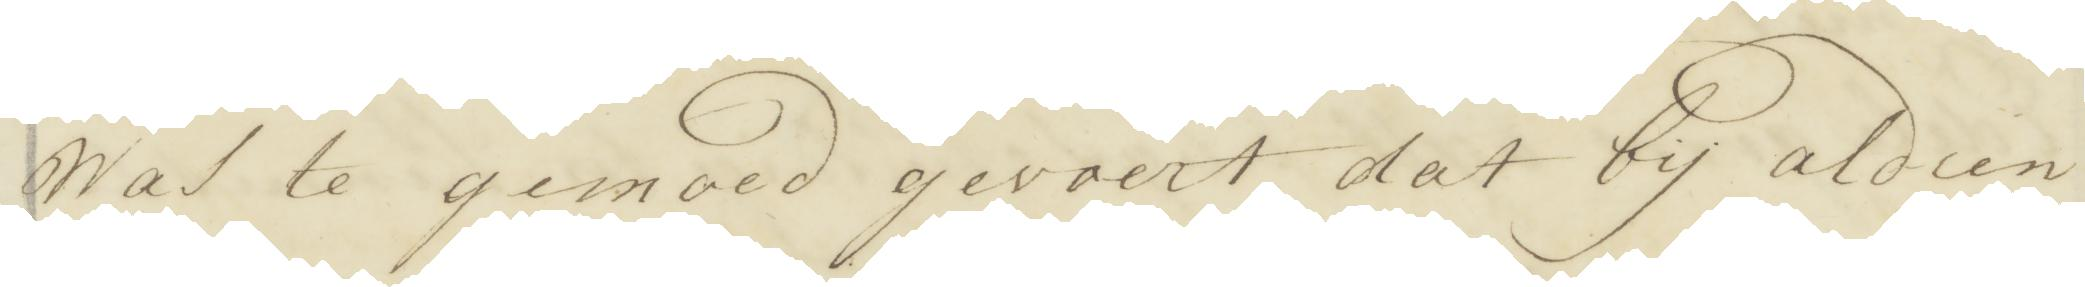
was te gemoed gevoert dat bij aldien
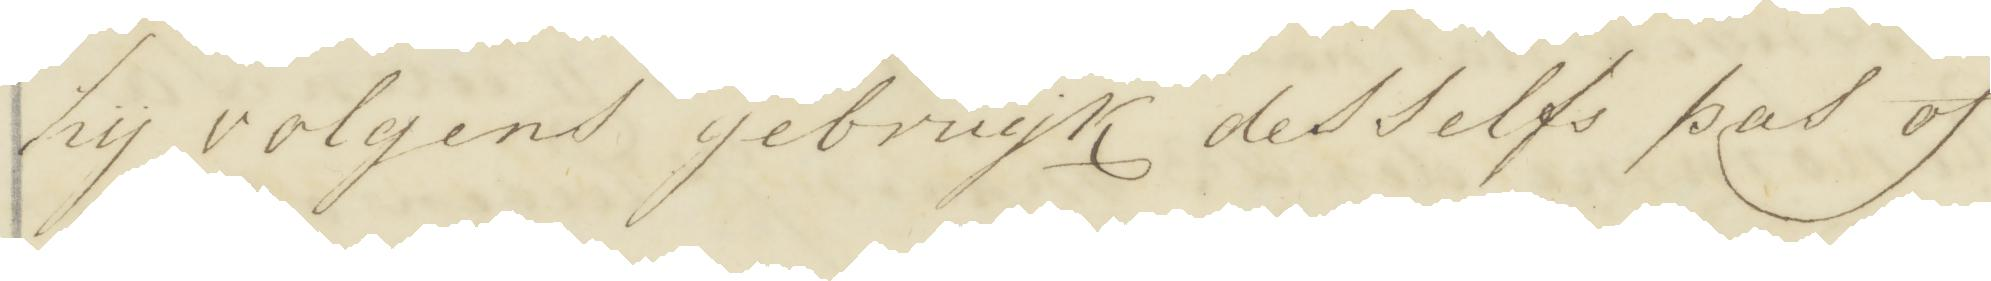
hij volgens gebruijk desselfs pas of
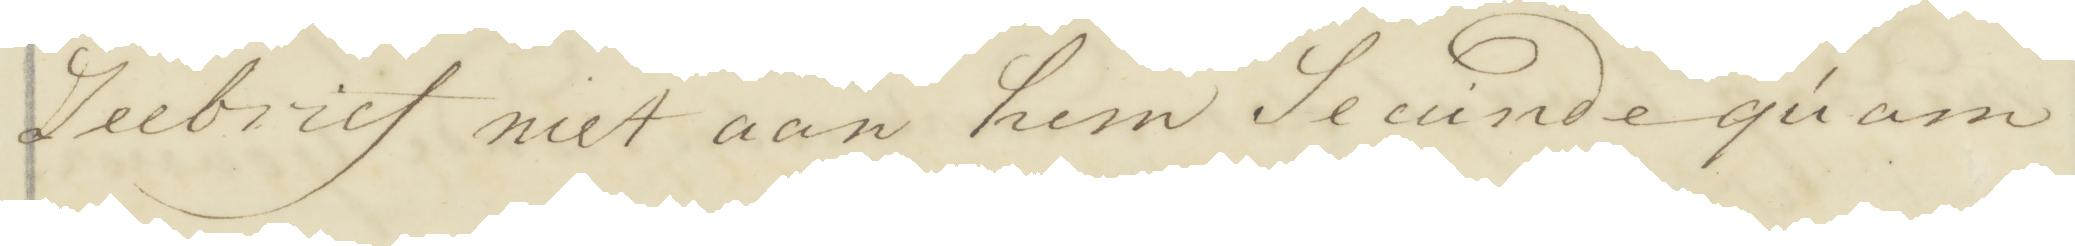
zeebrief niet aan hem secunde quam
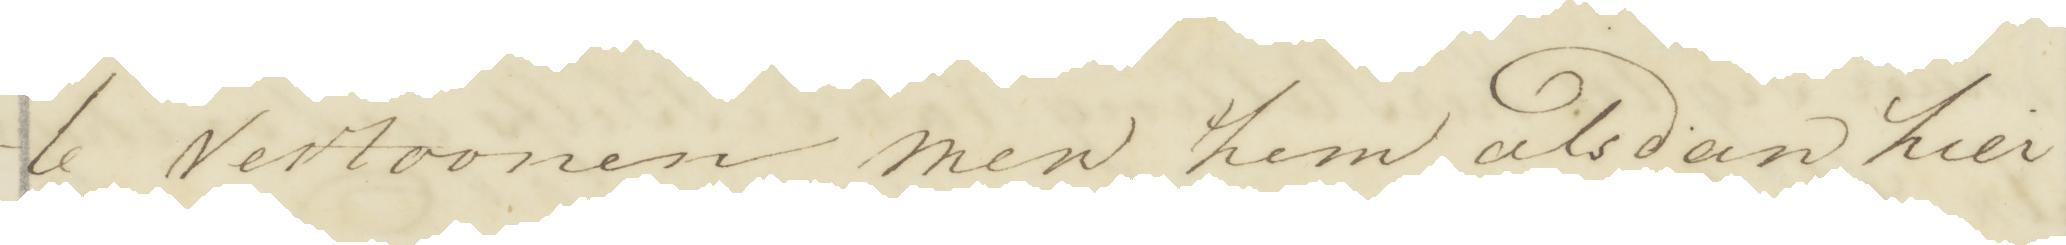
te vertoonen men hem alsdan hier
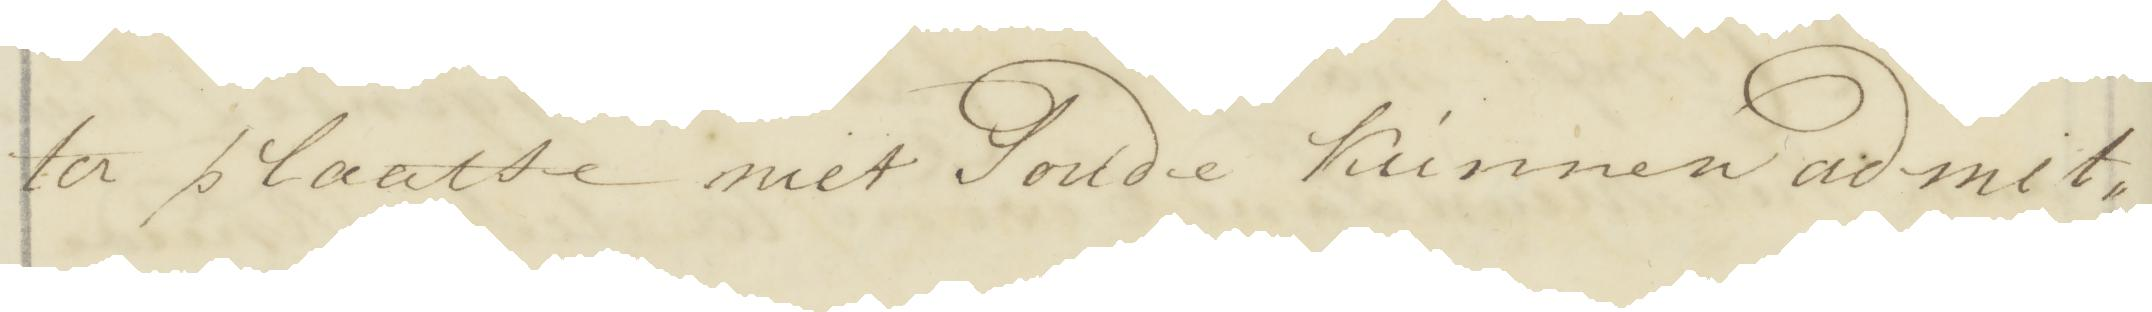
te plaatse niet soude kunnen admit„
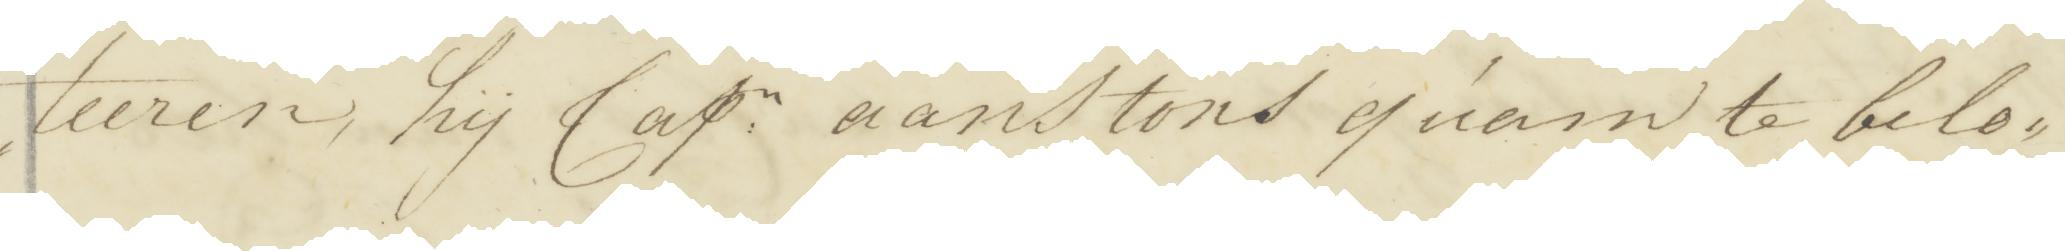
teeren, hij Cap:n aanstons quam te belo„
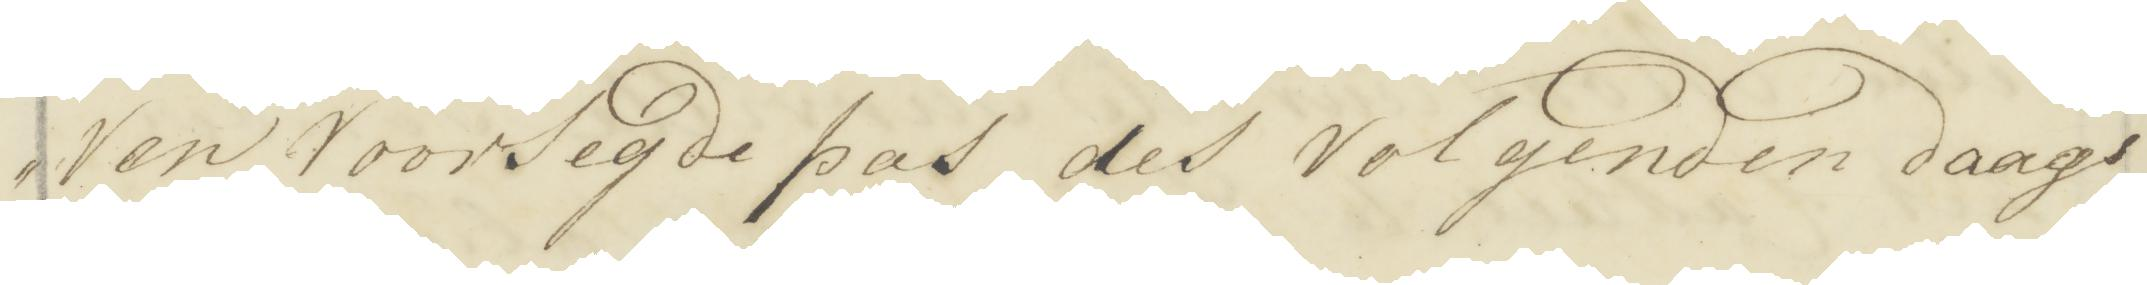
„ven voorsegde pas des volgenden daags
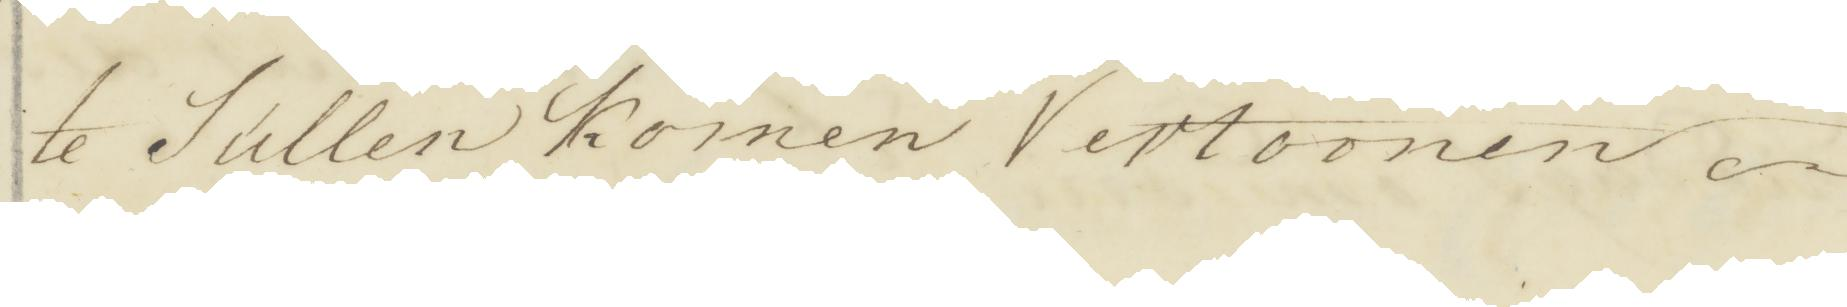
te sullen komen vertoonen —
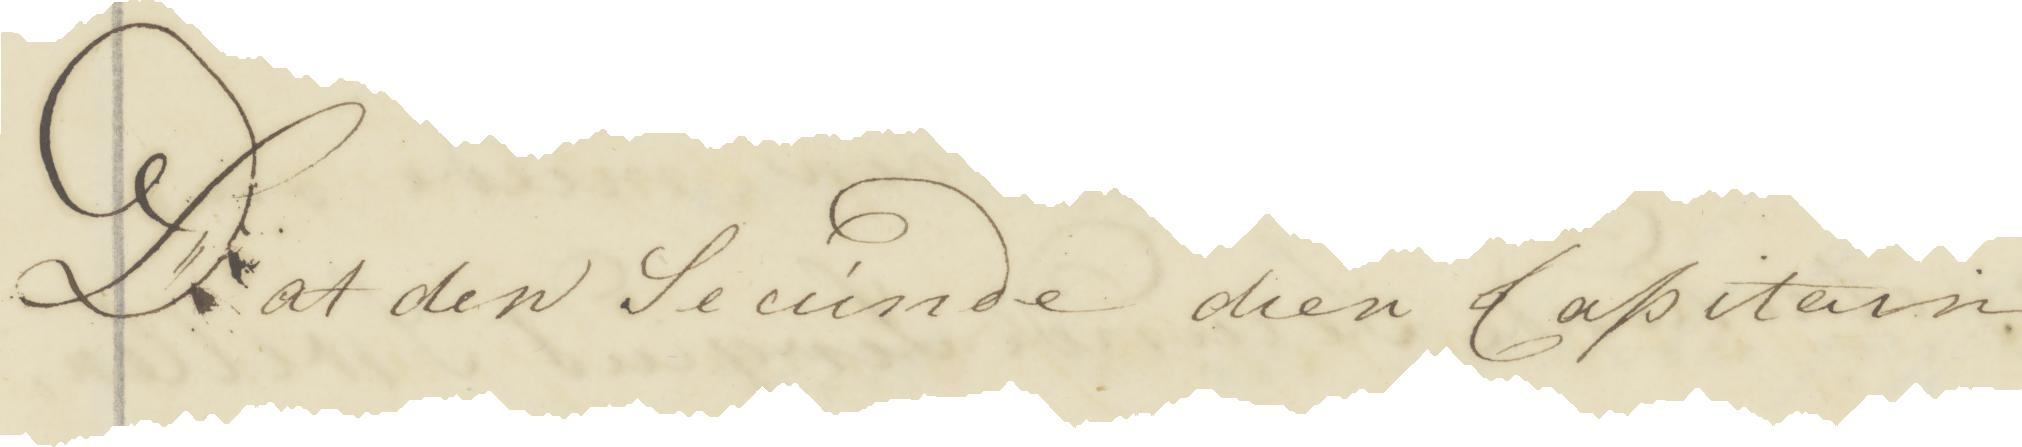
Dat den secunde dien Capitain
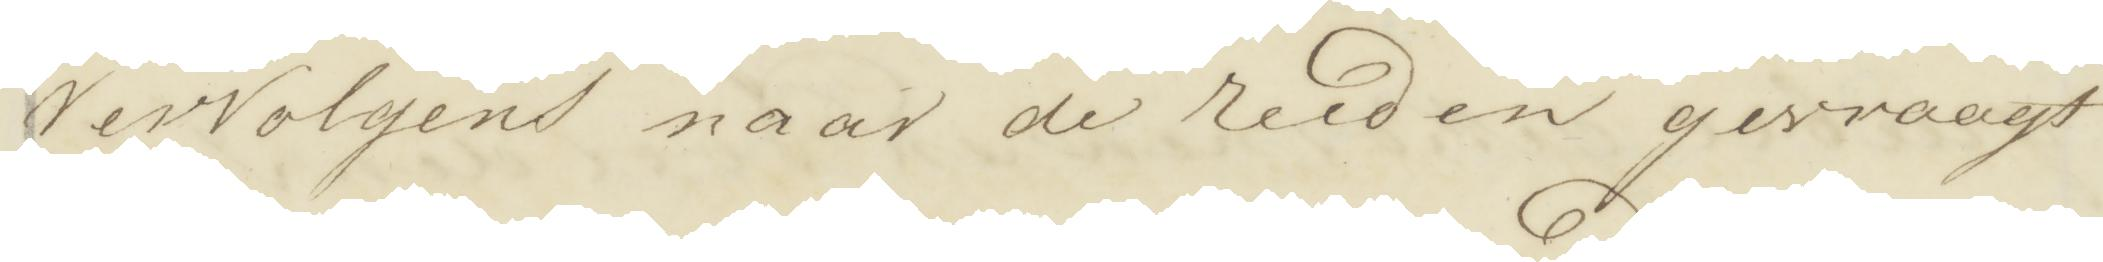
vervolgens naar de reeden gevraagt
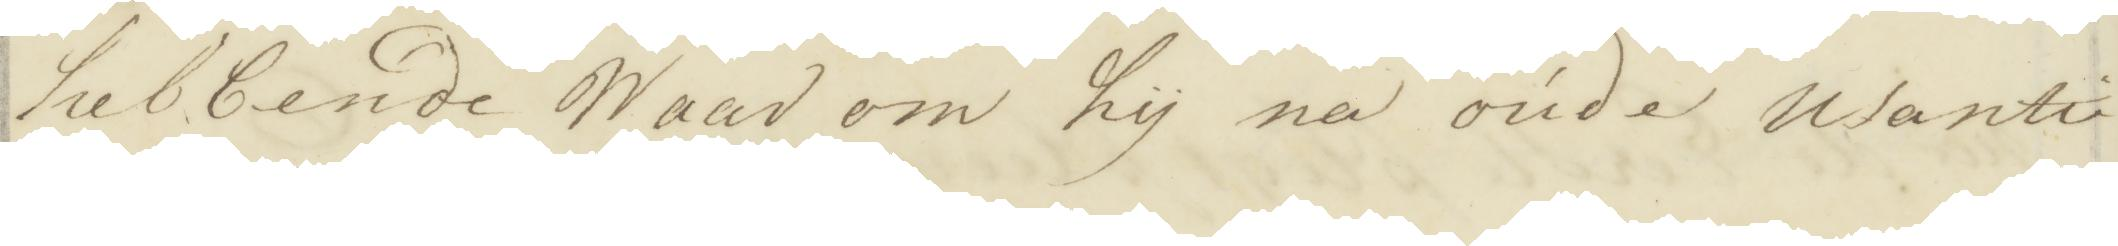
hebbende waar om hij na oude usanti
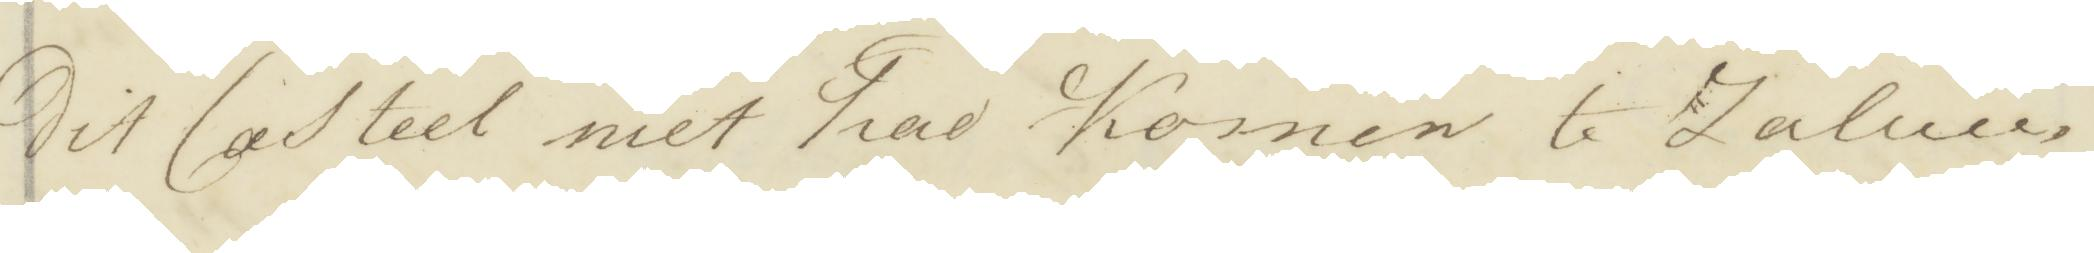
dit Casteel niet had komen te zaluee,
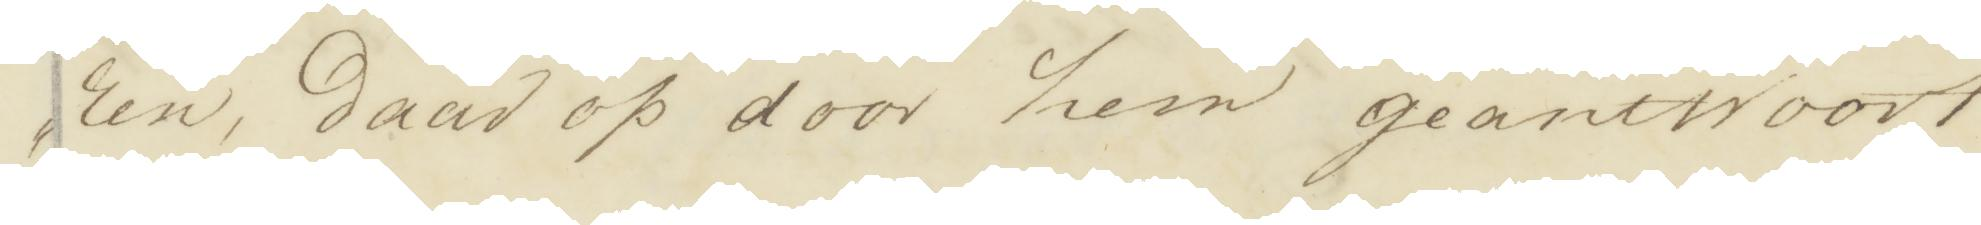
„ren, daar op door hem geantwoort
